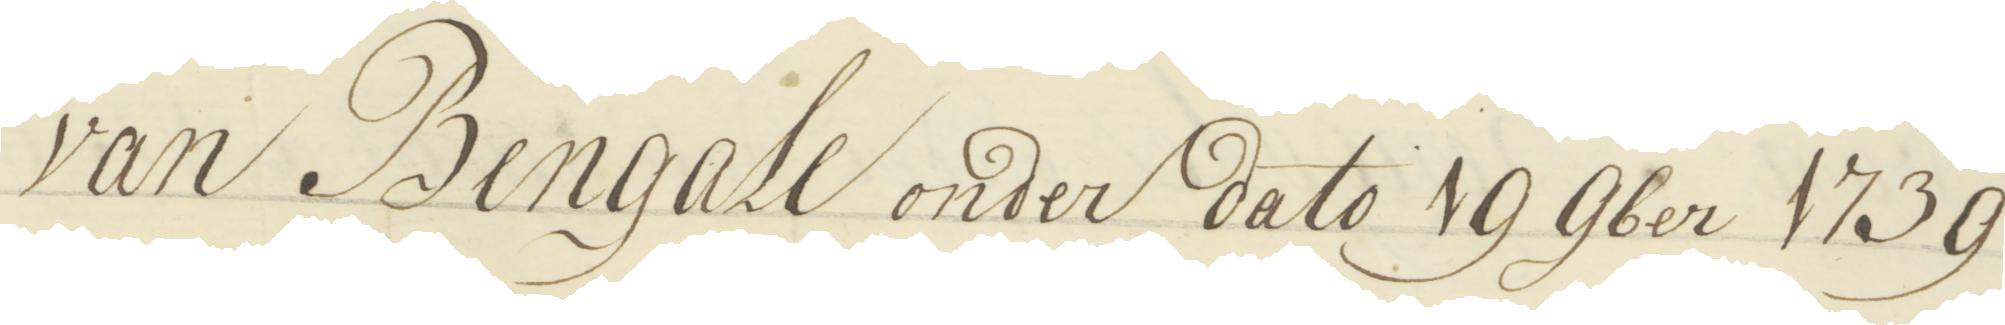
van Bengale onder dato 19 gber: 1739
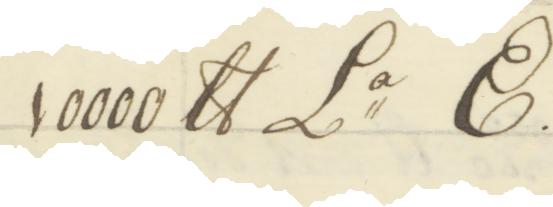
10000 lb L:a E
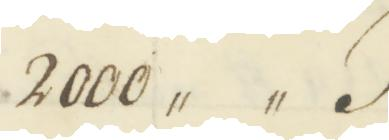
2000 „ „ F
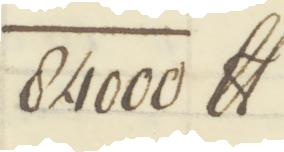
84000 lb
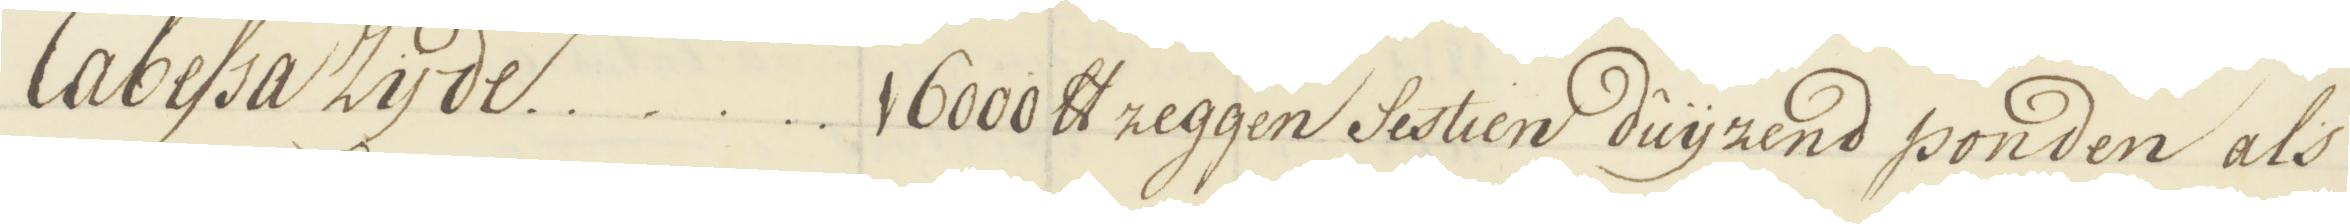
Cabessa zijde. . . . . . 16000 lb zeggen sestien duijzend ponden als
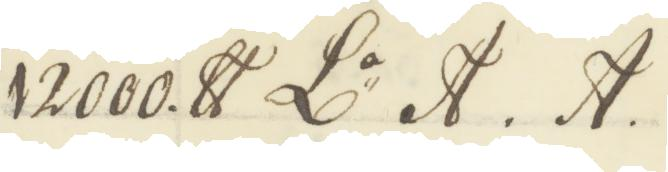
12000. lb L:a A. A.
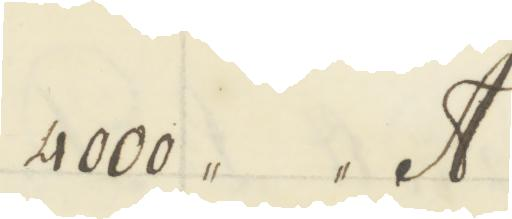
4000 „ „ A
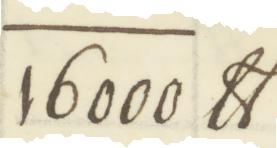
16000 lb
